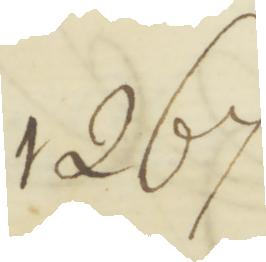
1267
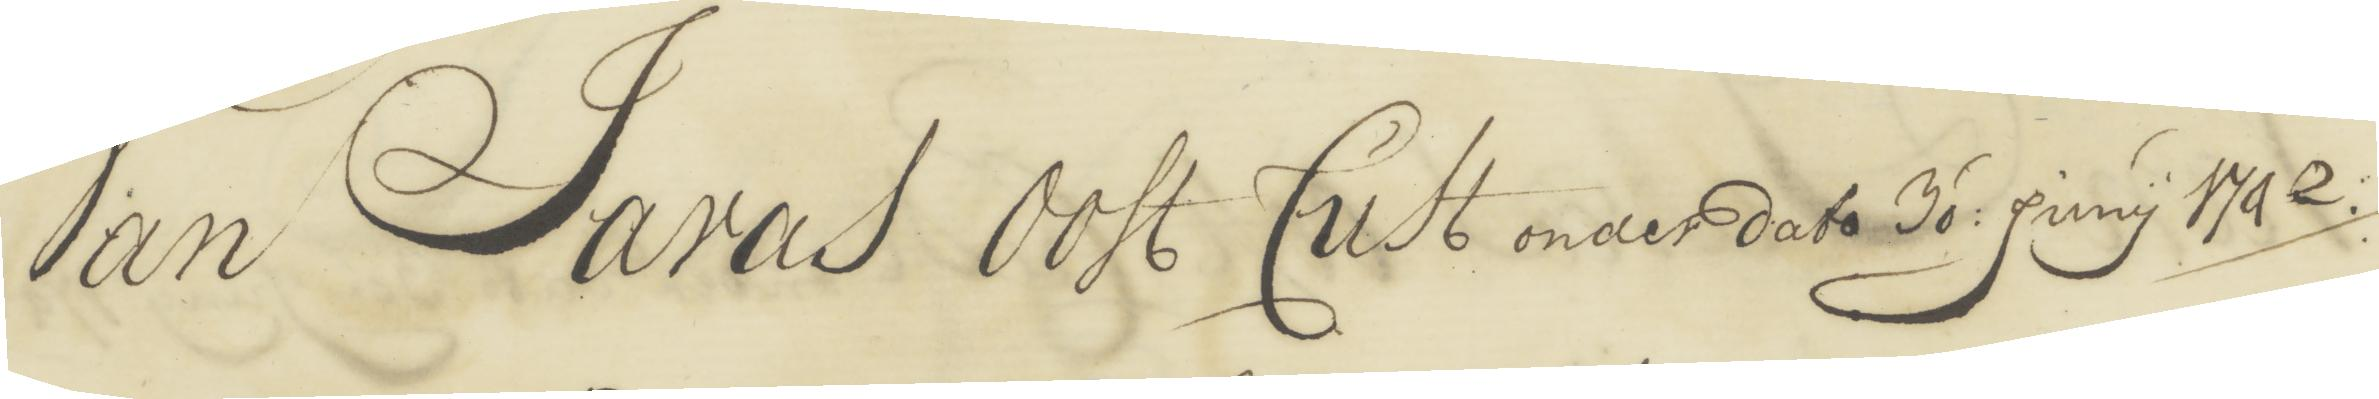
Van Iavas oost Cust onder dato 30:' Junij 1742:
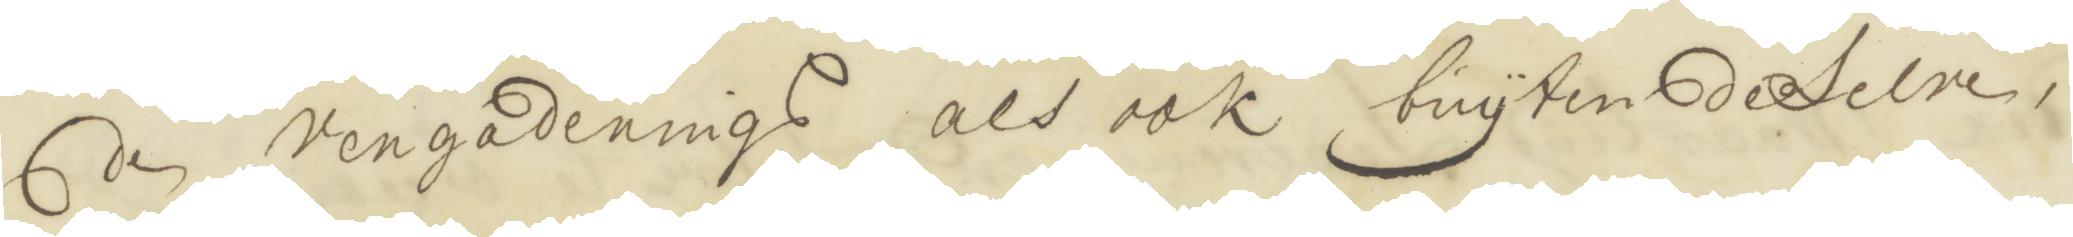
de vergaderings als ook buijten deselve,
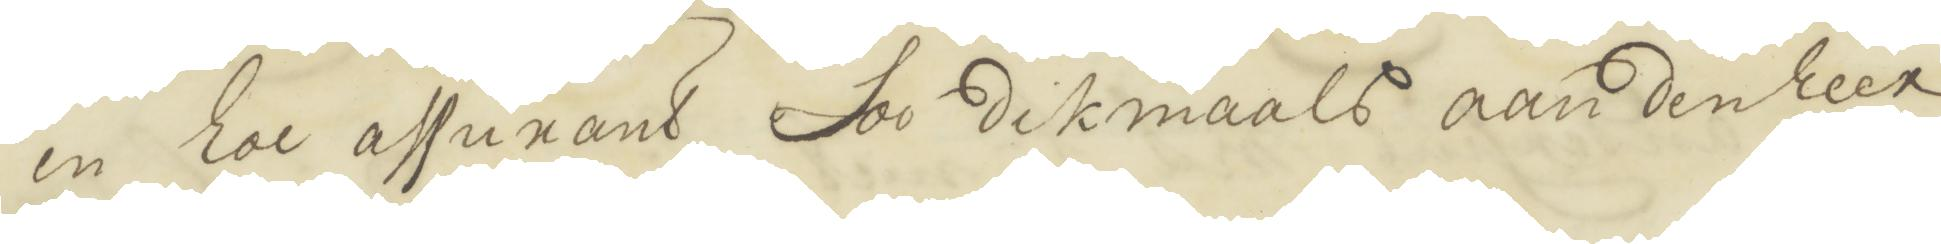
en hoe assurant soo dikmaals aan den heer
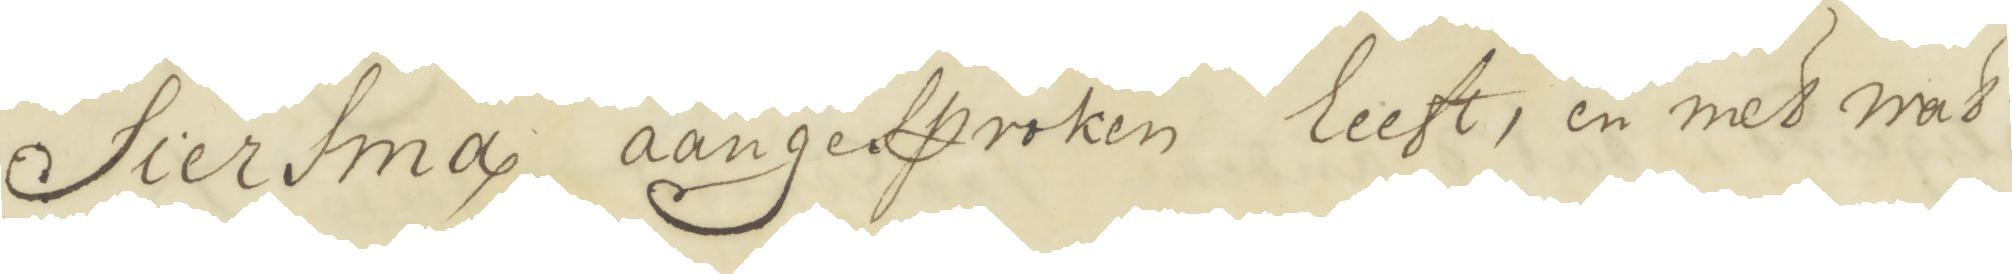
siersma aangesproken heeft, en met wat
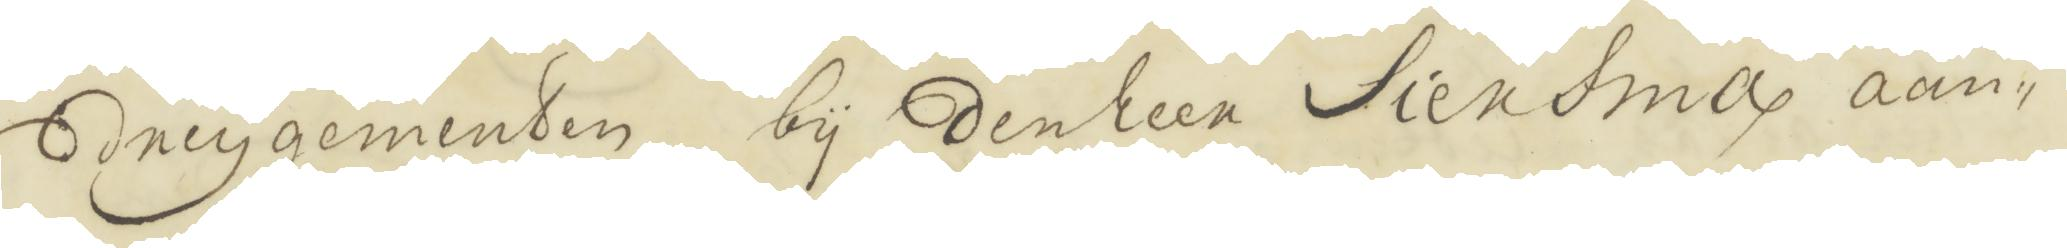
dreijgementen bij den heer siersma aan„
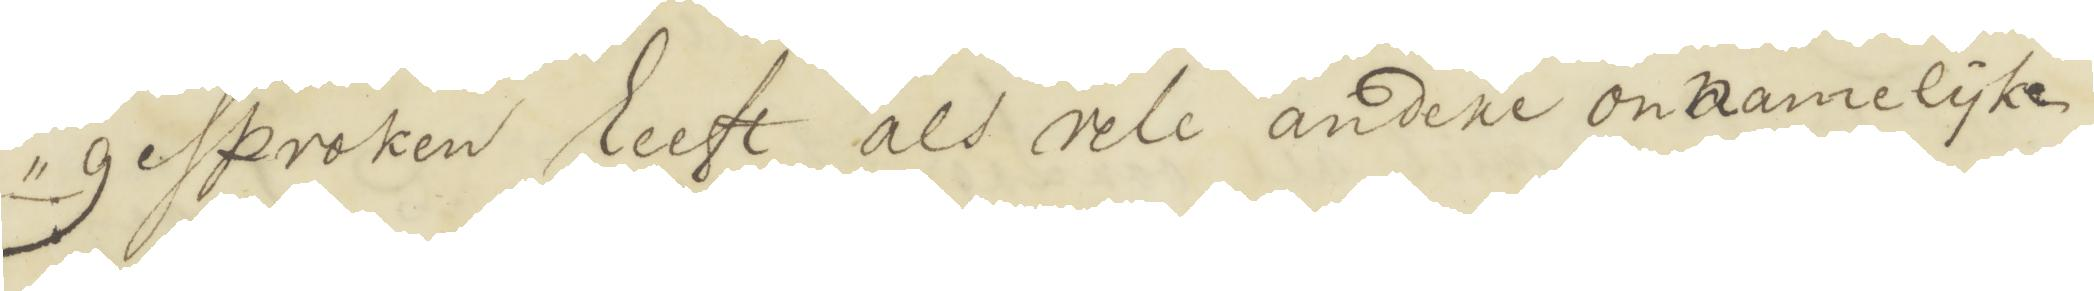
„gesproken heeft als vele andere onnamelijke
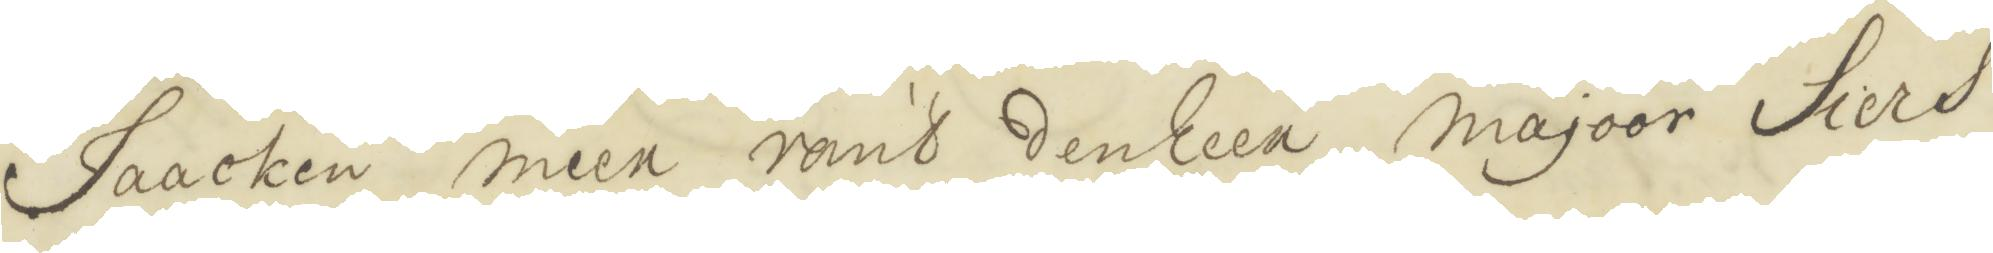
saacken meer van't den heer majoor siers
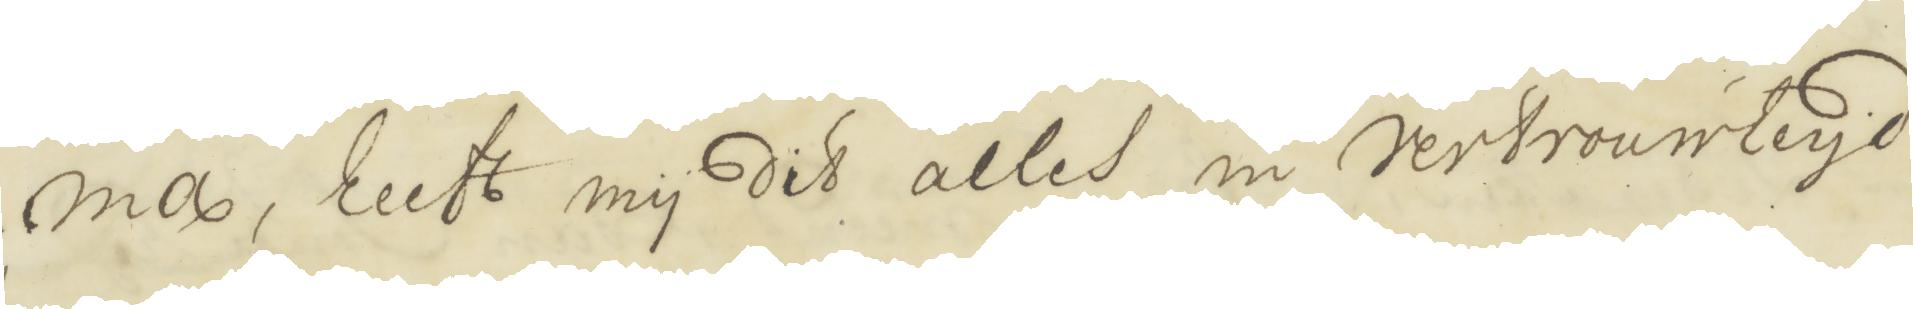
ma, heeft mij dit alles in vertrouwheijd
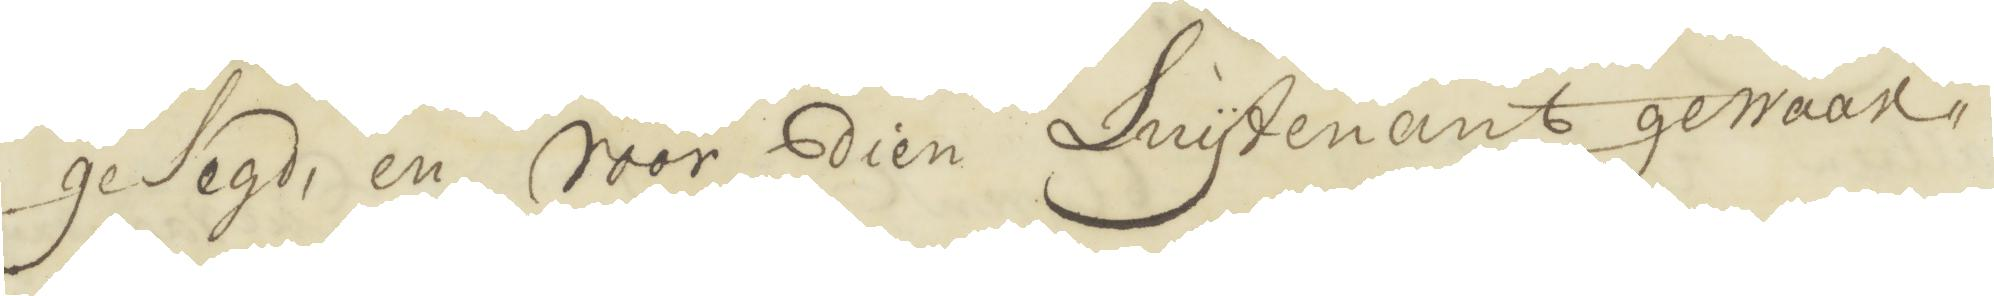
gesegd, en voor dien luijtenant gewaar„
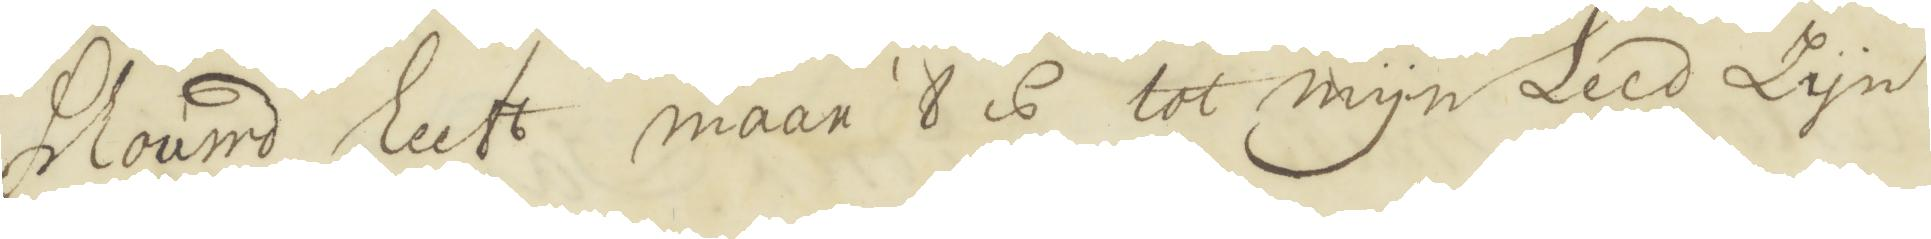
schouwd heeft maar 't is tot mijn leed zijn
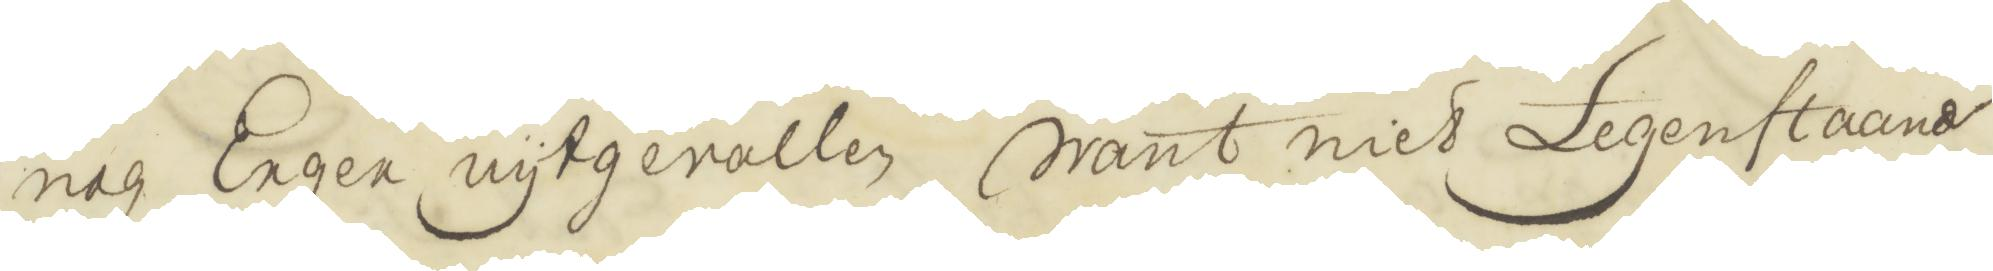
nog Erger uijtgevallen want niet tegenstaande
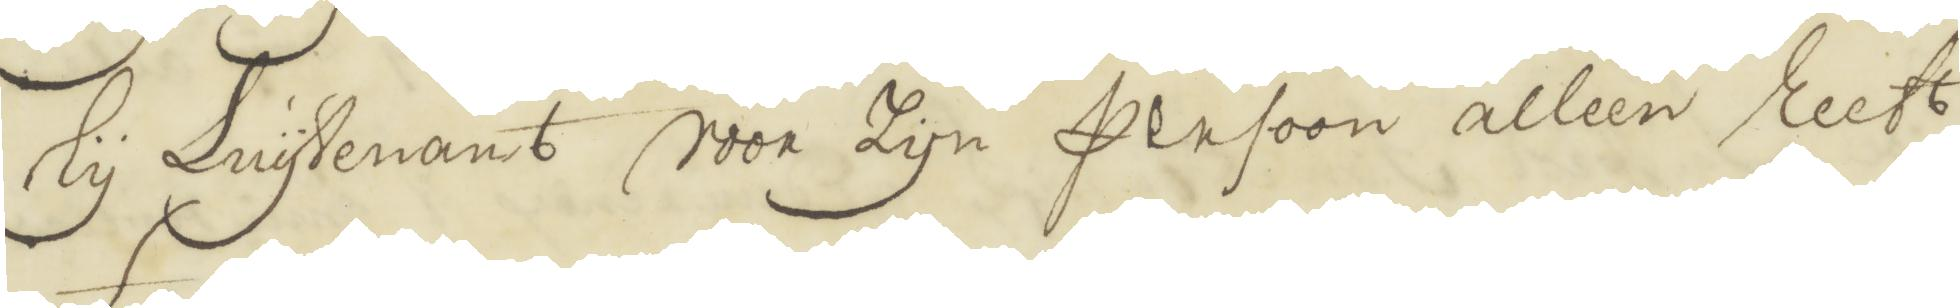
hij luijtenant voor zijn persoon alleen heeft
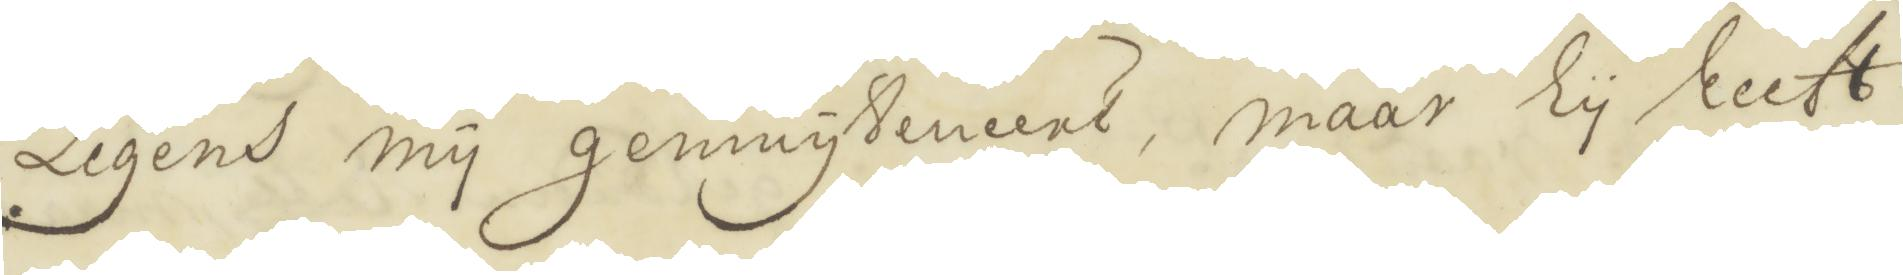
tegens mij gemuijteneert, maar hij heeft
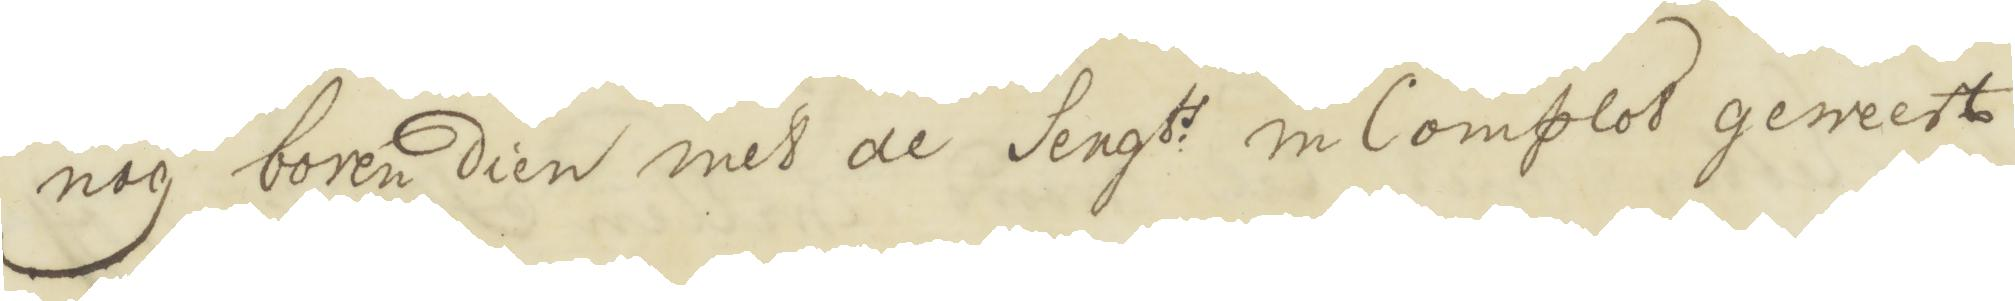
nog boven dien met de serg:ts in Complot geweest
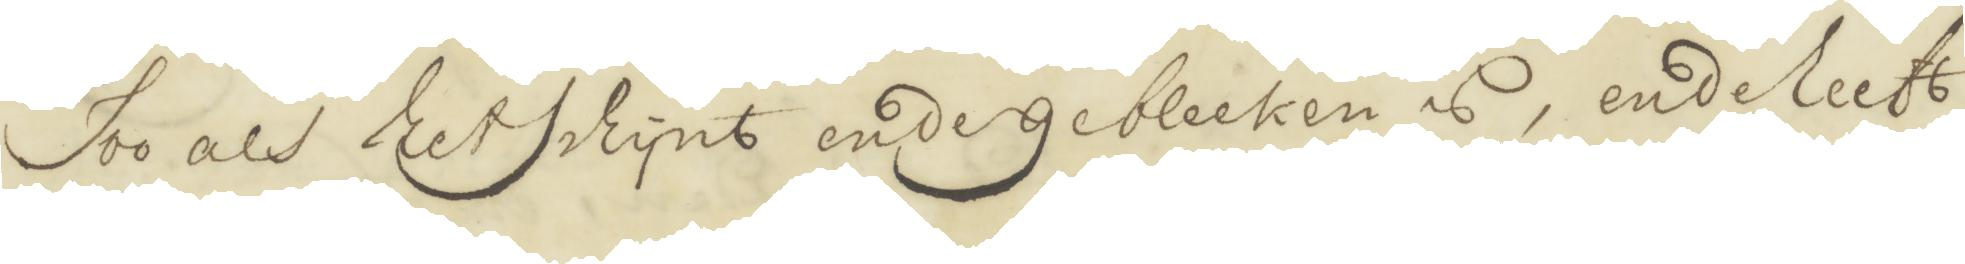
soo als het schijnt ende gebleeken is, ende heeft
